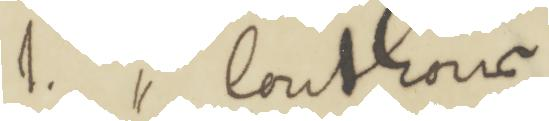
1. „ lonthoir
